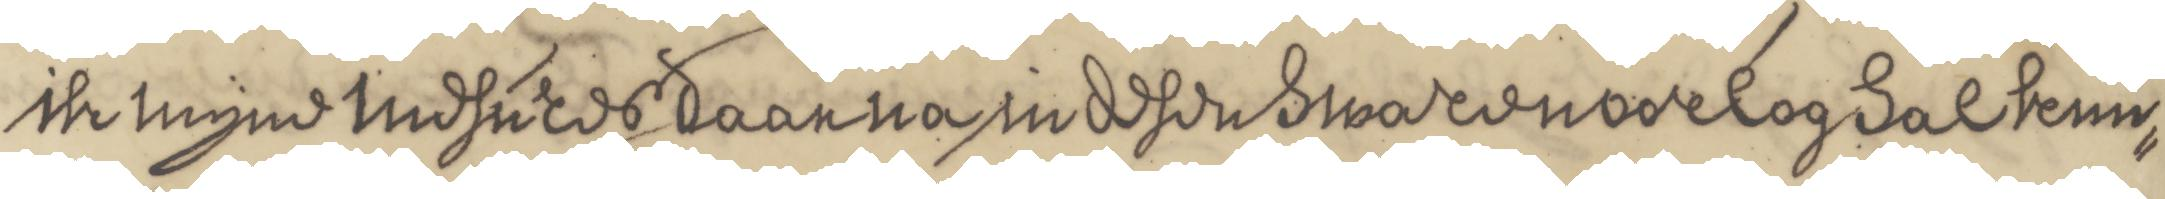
ik mijne mesures daar na in desen swaren oorlog sal kun„
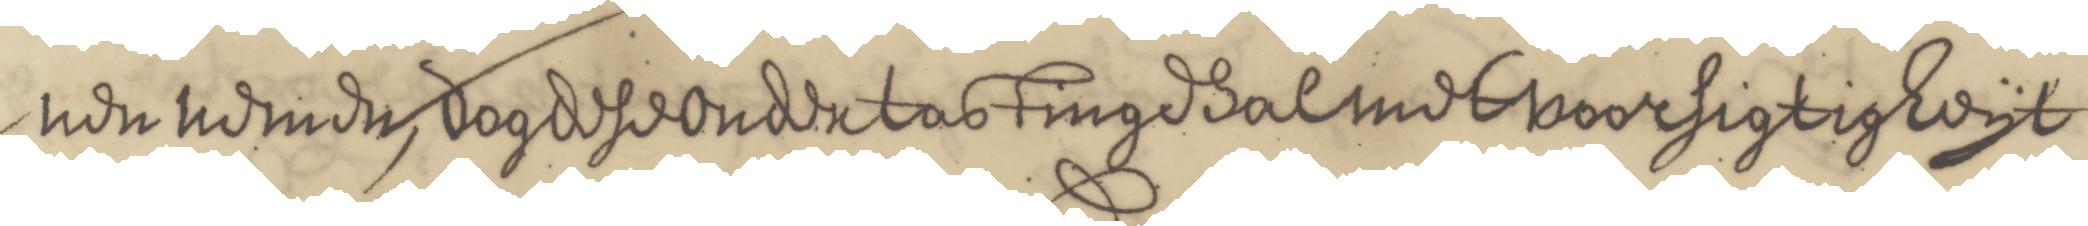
„nen nemen, dog dese ondertastinge sal met voor sigtigheijt
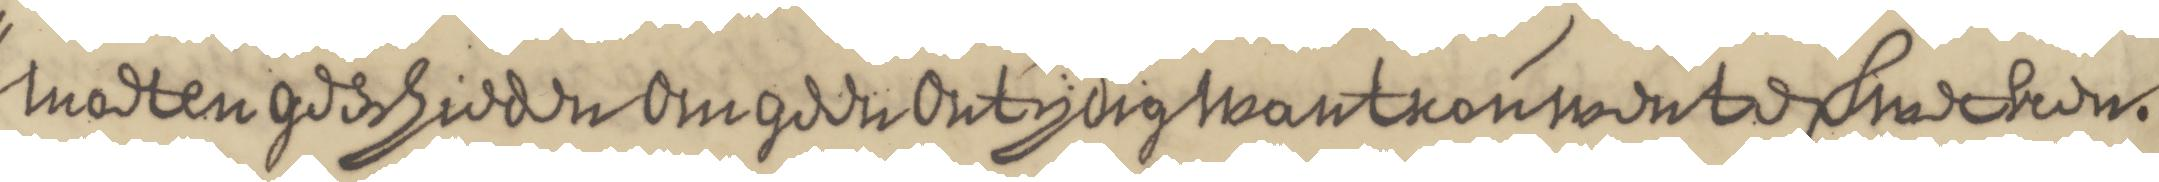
moeten geschieden om geen ontijdig wantrouwen te verwecken.
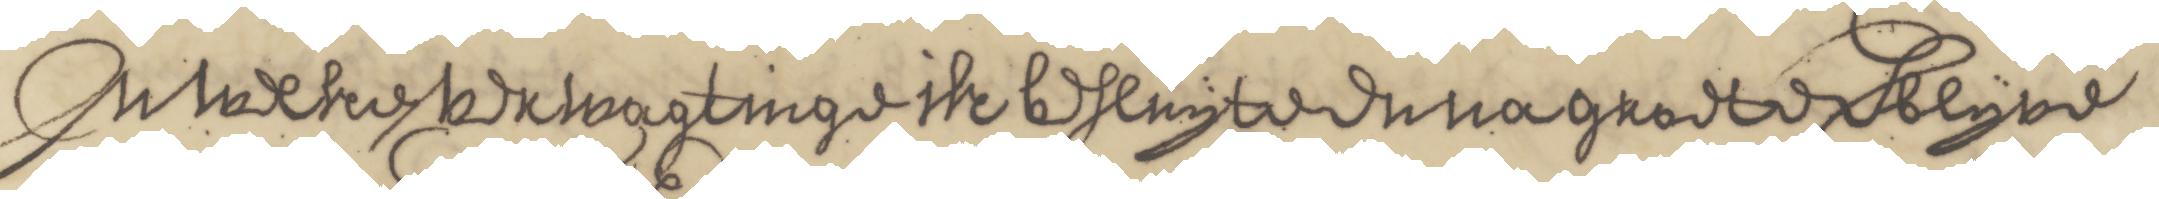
Jn welke verwagtinge ik besluijte en na groete verblijve
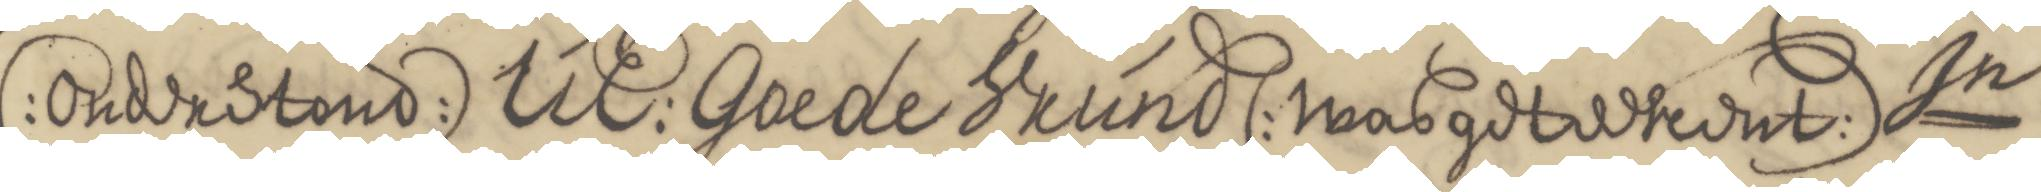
(:onderstond:) UE: Goede Vrund (:was geteekent:) I=n
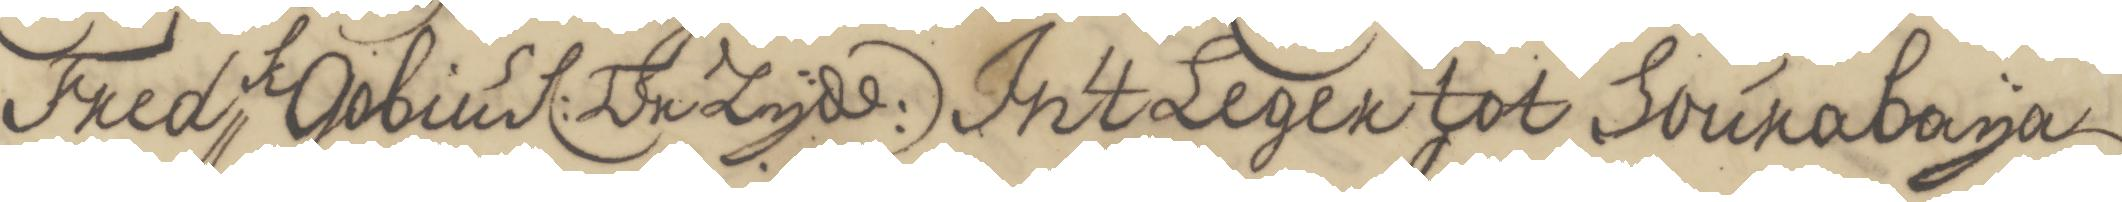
Fred„k Gobius (:Ter Zijde:) In't Leger tot Sourabaija
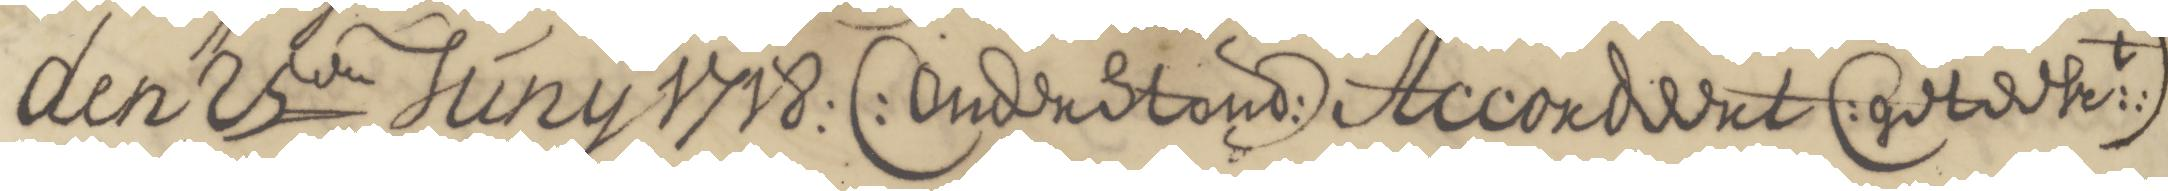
den 25=en Iunij 1718: (:Onderstond:) Accordeert (:geteek:t :)
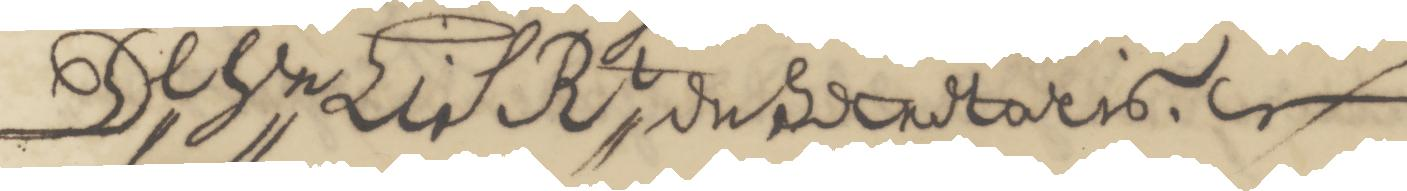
D„l V„n Lis R„t en secretaris.-
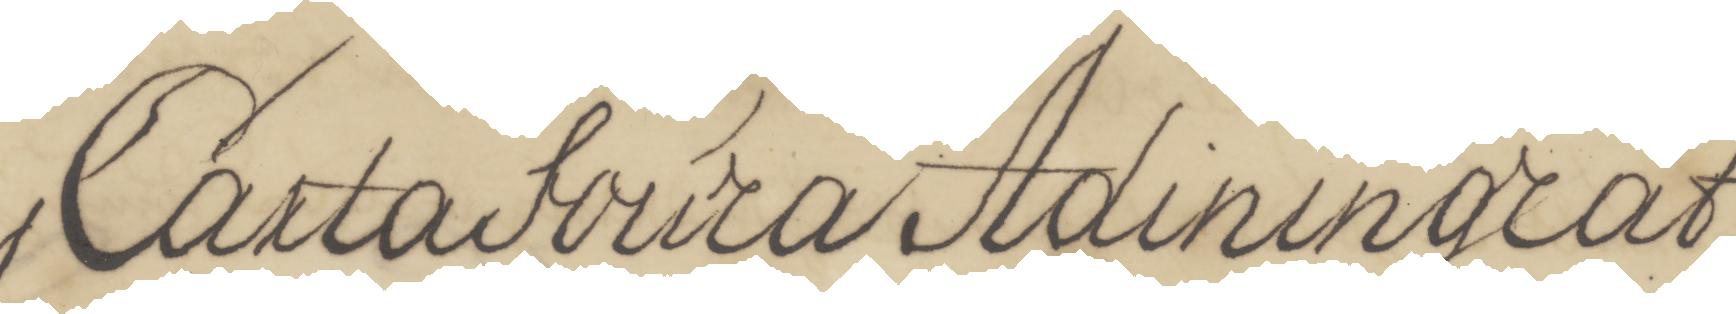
Cartasoura Adiningrat
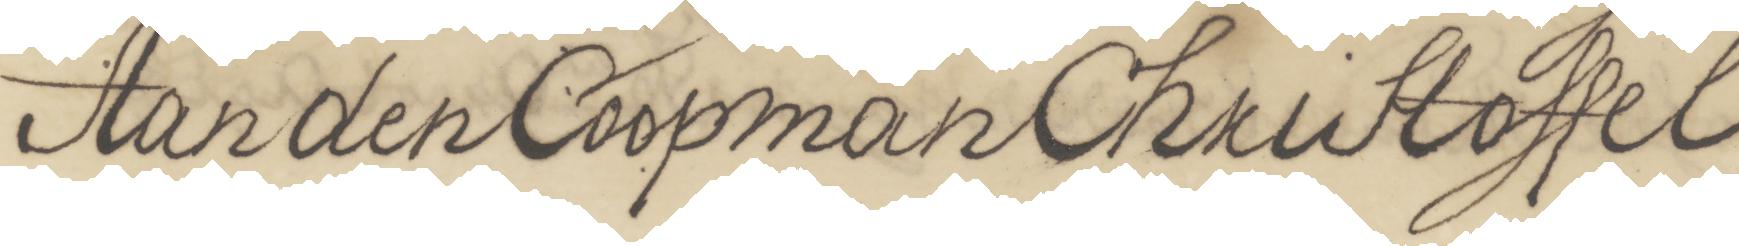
Aan den Coopman Christoffel
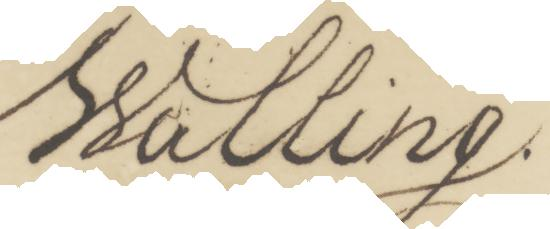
Walling.
